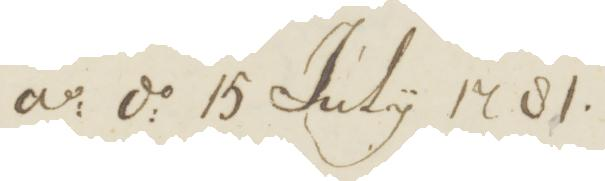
a:o d:o 15 Iulij 1781.
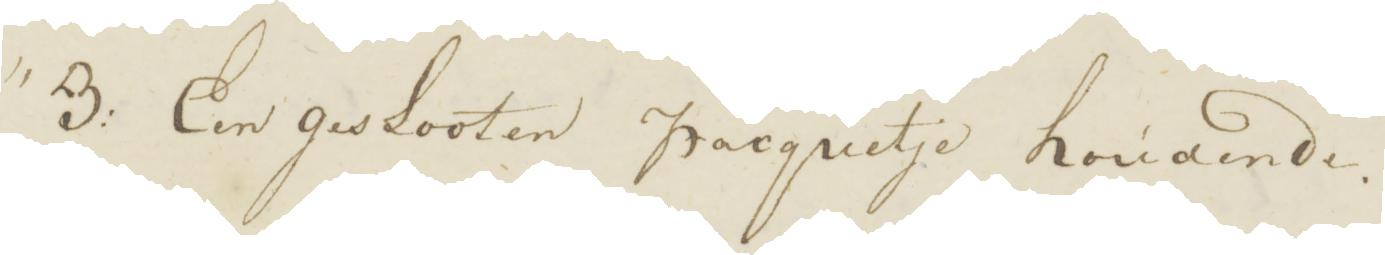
„ 3: Ein geslooten pacquetje houdende.
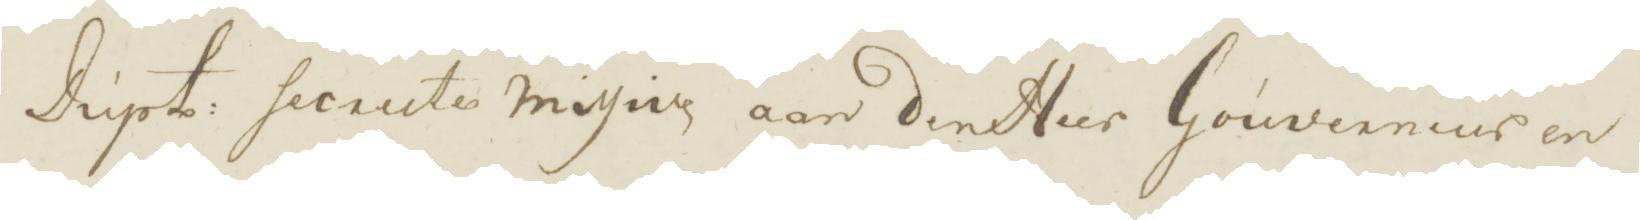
Dupl: secreete missiven aan den Heer Gouverneur en
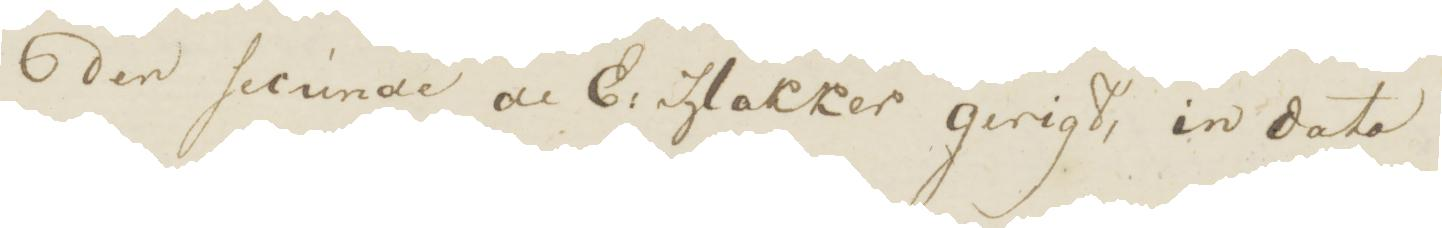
den secunde de E: Hakker gerigt, in dato
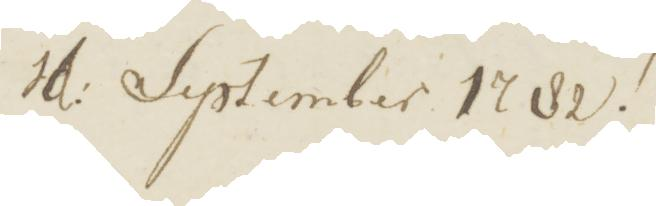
14: September 1782!
